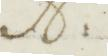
A:
